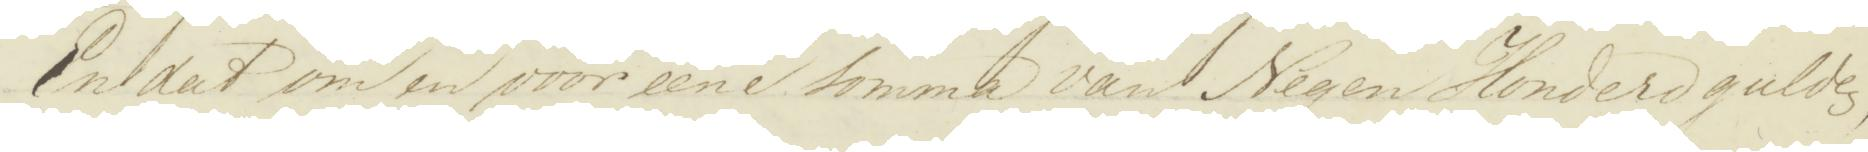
En dat om en voor eene somma van Negen Honderd gulden
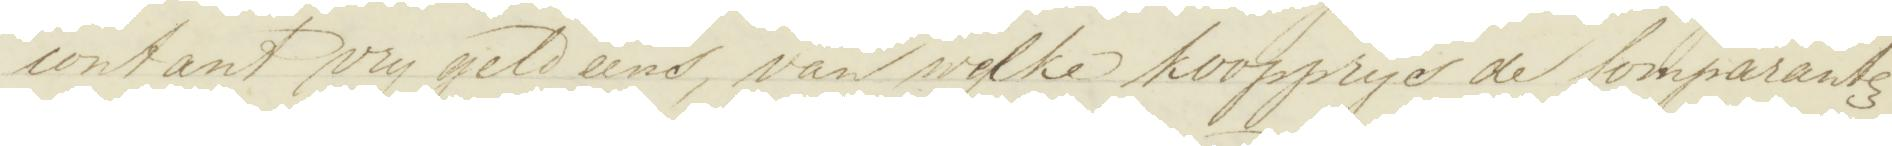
contant vry geld eens, van welke koopprys de Comparanten
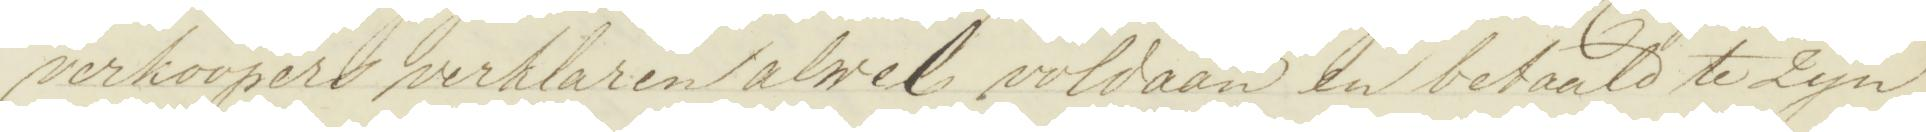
verkoopers verklaren alwel voldaan en betaald te zyn,
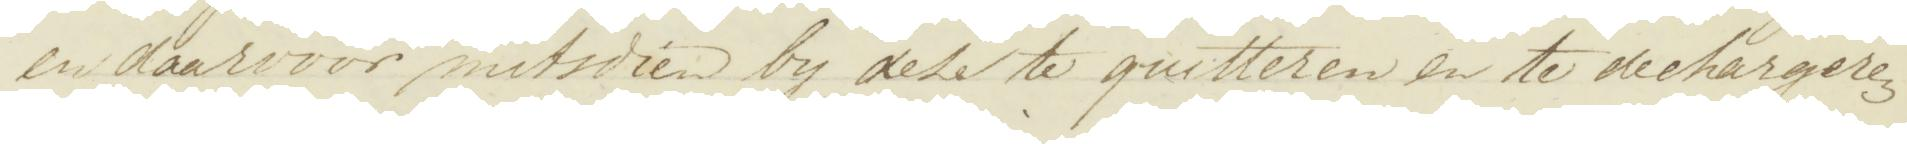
en daarvoor mitsdien by deze te quitteren en te dechargeren
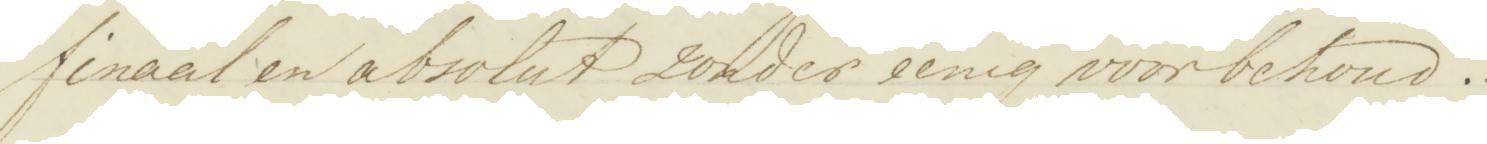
finaal en absolut zonder eenig voorbehoud.
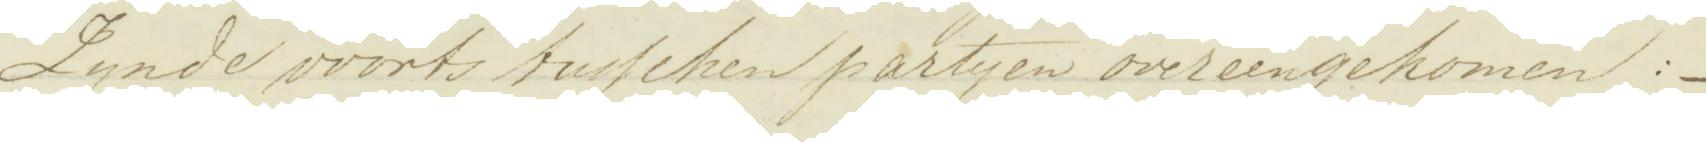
Zynde voorts tusschen partyen overeengekomen:
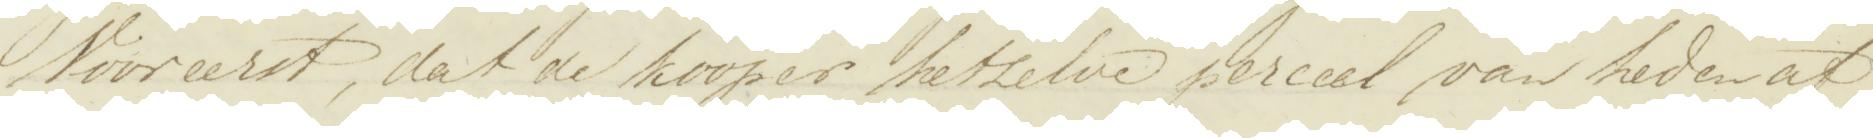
Vooreerst, dat de kooper hetzelve perceel van heden af
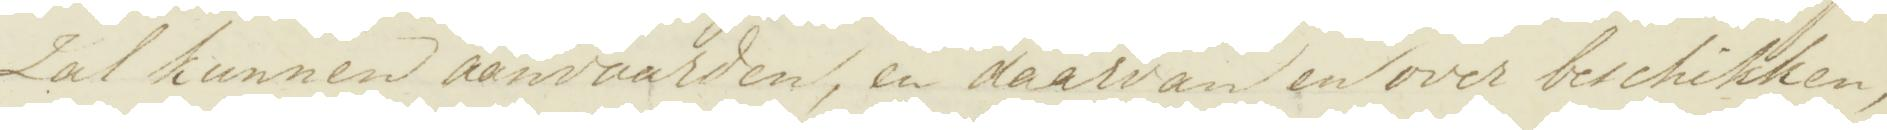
zal kunnen aanvaarden, en daarvan en over beschikken
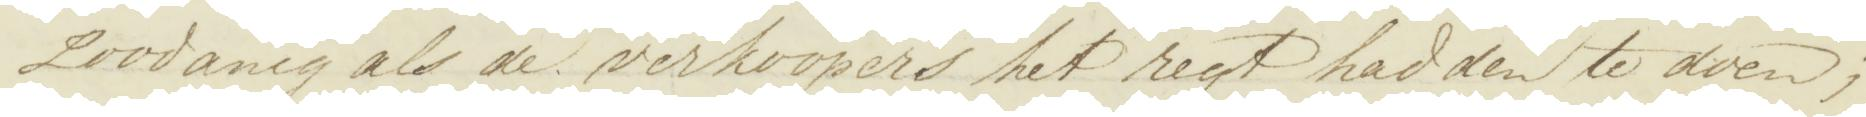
zoodanig als de verkoopers het regt hadden te doen
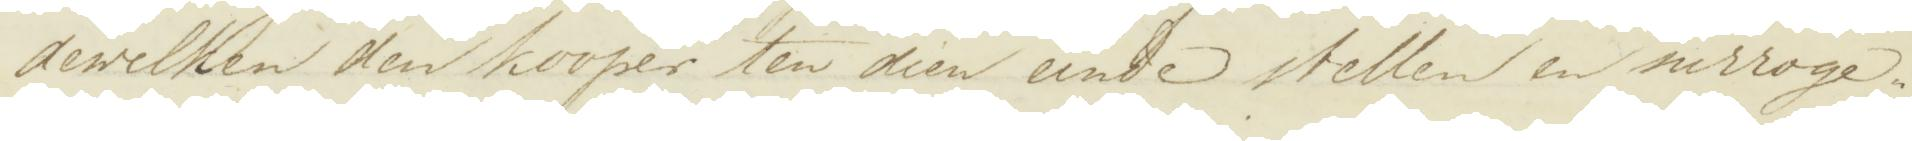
dewelken den kooper ten dien einde stellen en surroge„
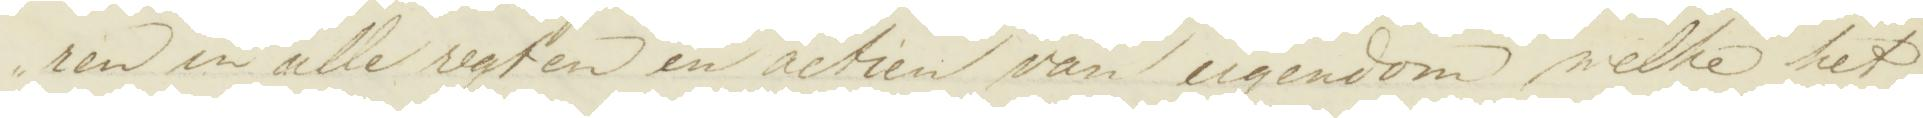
„ren in alle regten en actien van eigendom welke het
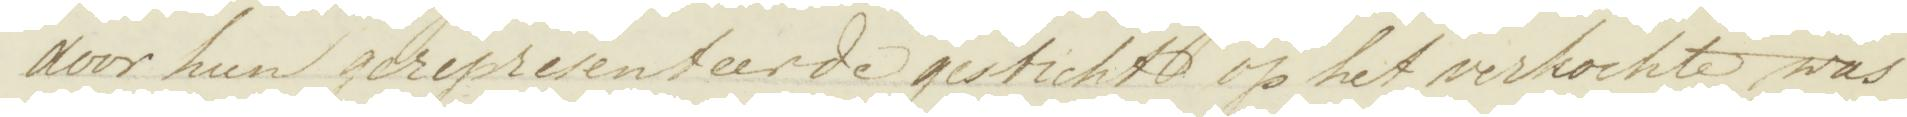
door hun gerepresenteerde gesticht op het verkochte was
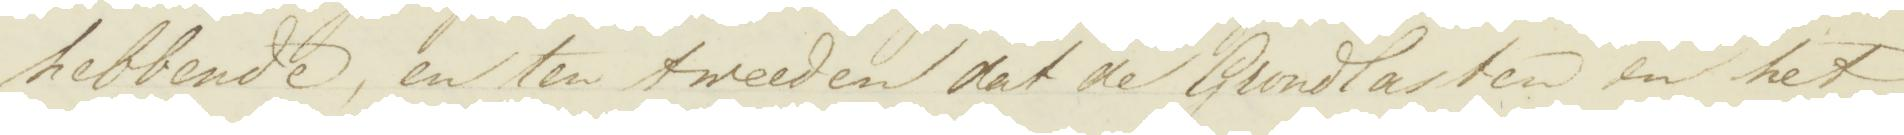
hebbende, en ten tweeden dat de Grondlasten en het
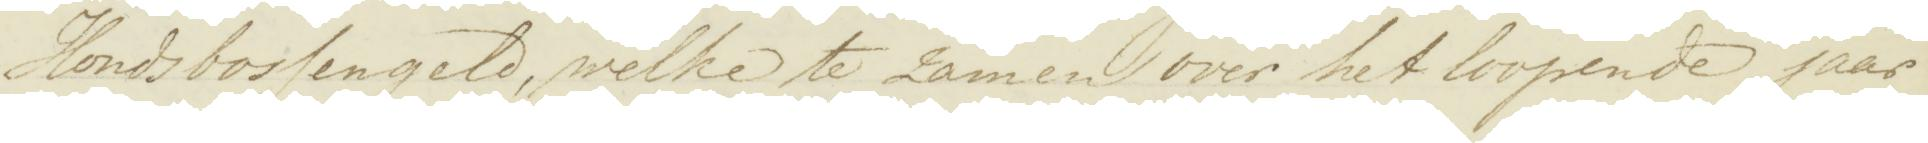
Honds bossengeld, welke te zamen over het loopende jaar
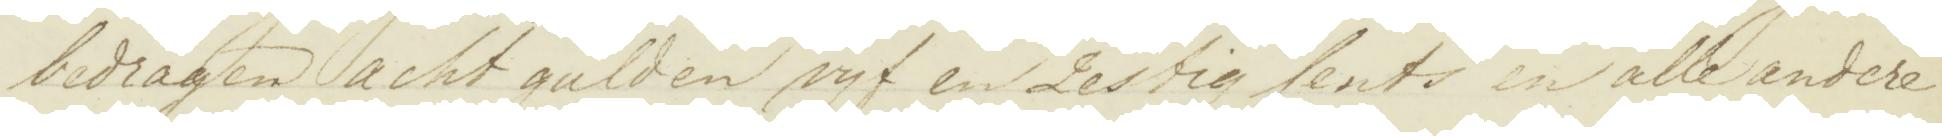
bedragen acht gulden vyf en zestig Cents en alle andere
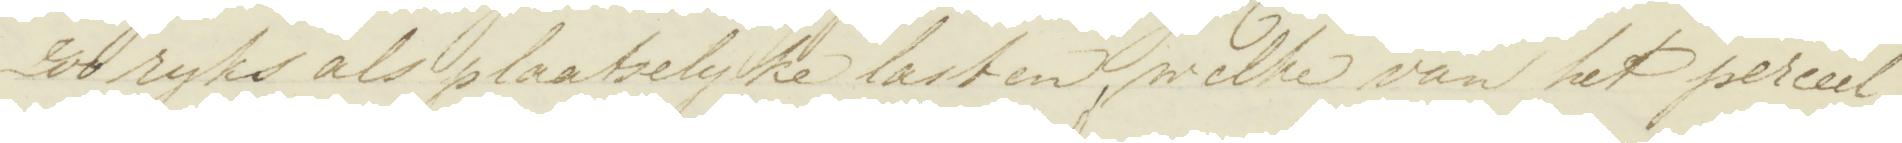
zoo ryks als plaatselyke lasten, welke van het perceel
